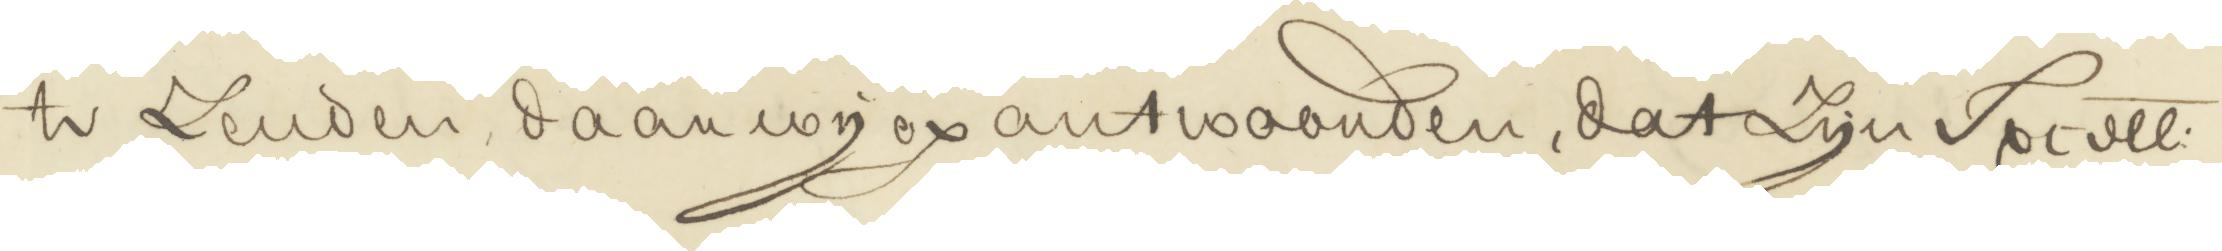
te zenden, daar wij op antwoorden, dat zijn Excell:
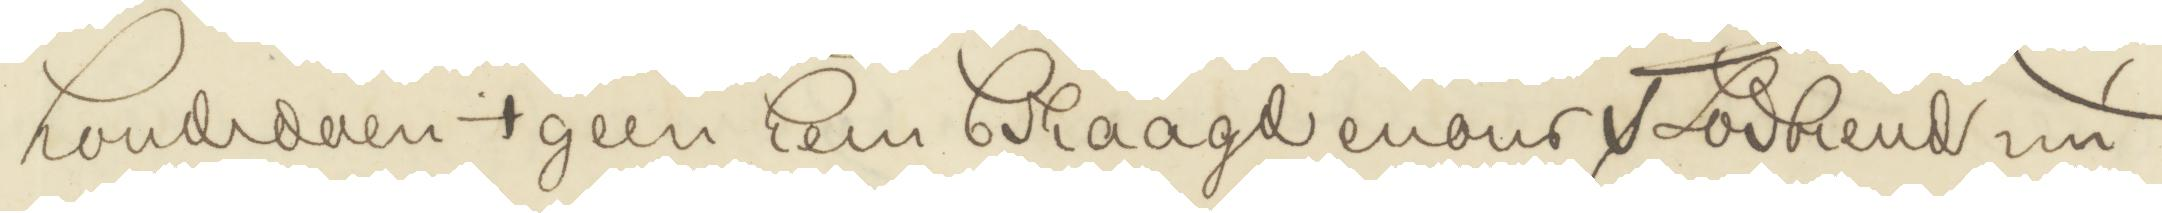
konde doen ’t geen hem behaagd en ons versoekende nu
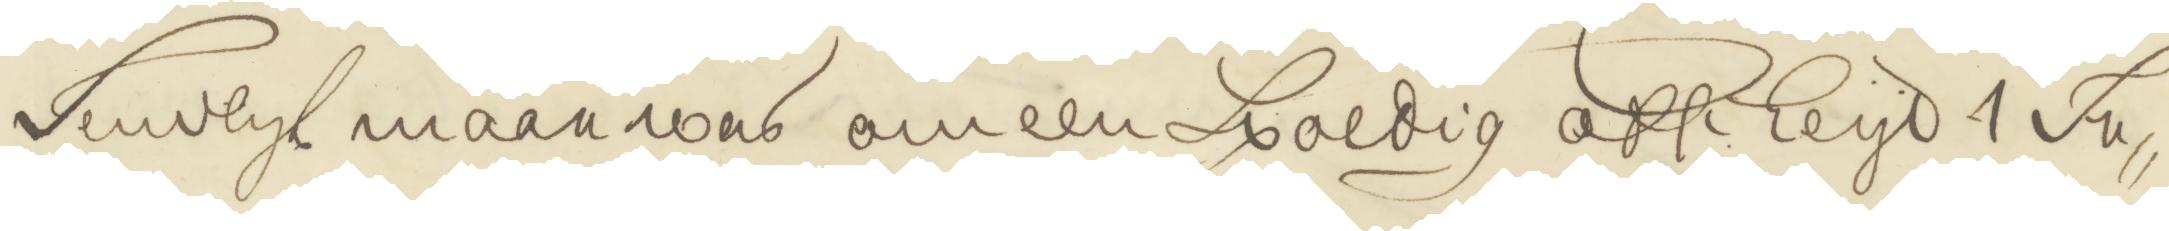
Eenelyk maar was om een spoedig afscheijd 1 Er„
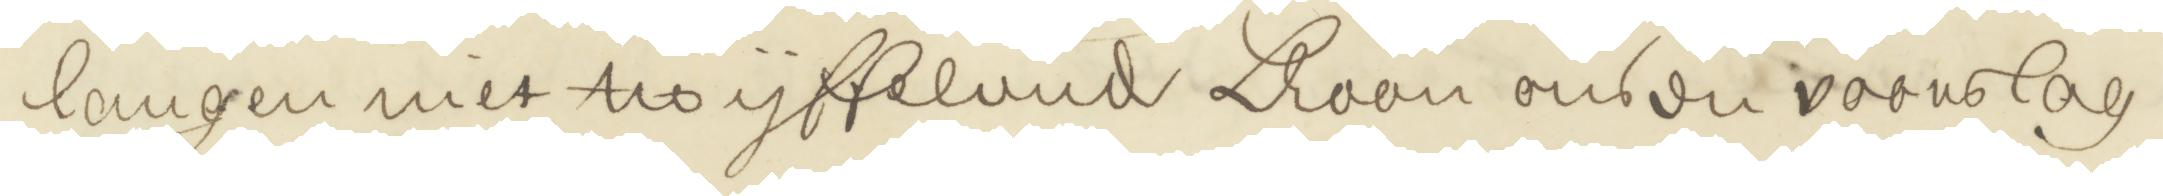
langen niet twijffelende schoon onsen voorslag
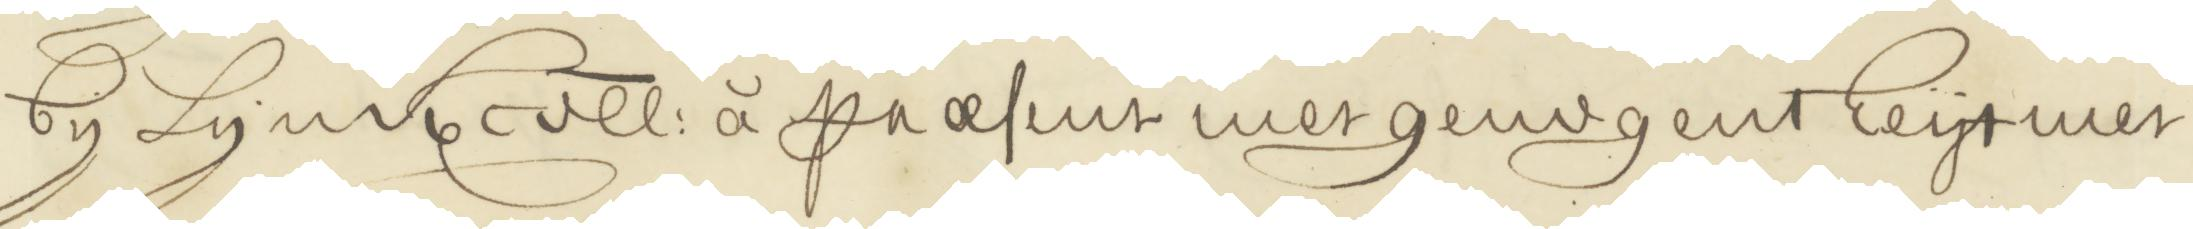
by zijn Excell: à praesent met genegentheijt niet
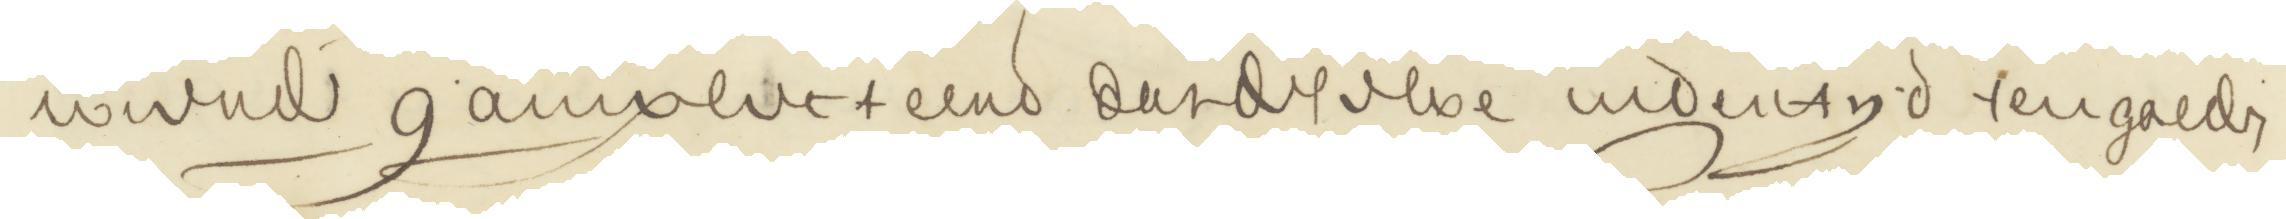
wierde g'amplecteerd dat deselve indertijd ten goeden
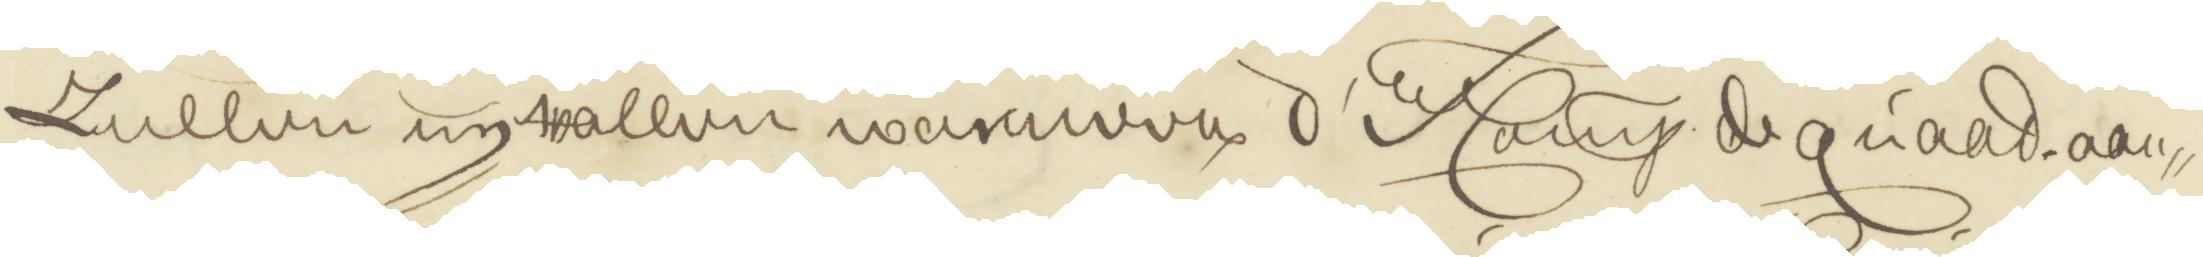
zullen uijtvallen wanneer d’ EComp: de quaad-aar„
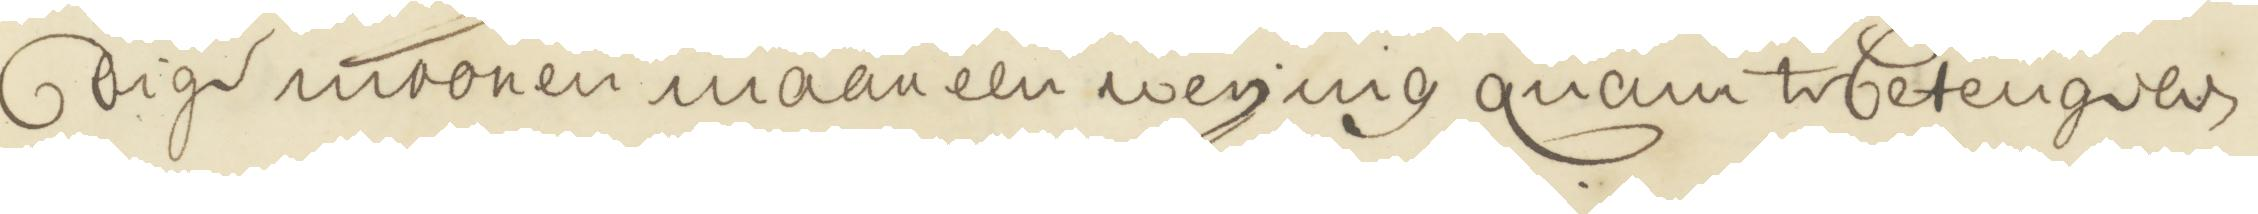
dige mooren maar een weijnig quam te beteugelen
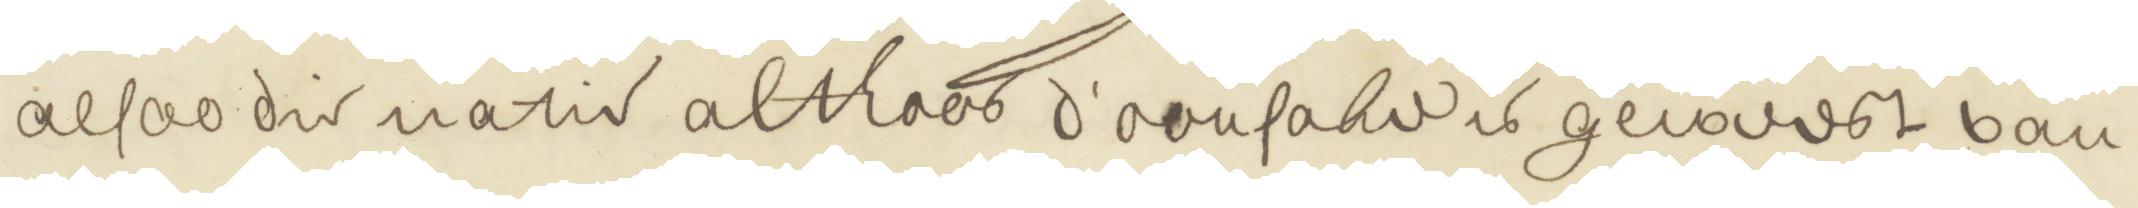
alsoo die natie althoos d’ oorsake is geweest van
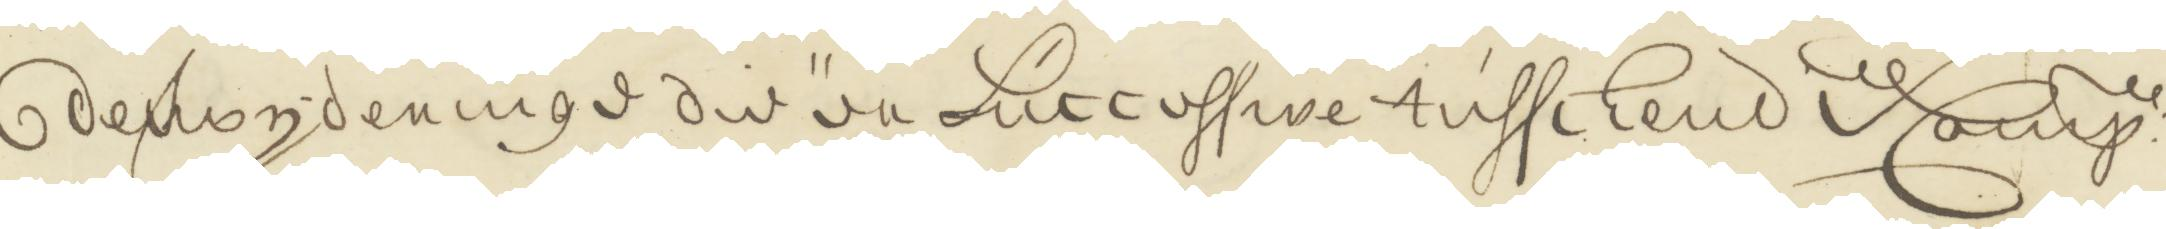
deverwijderinge die ''er successive tusschend EComp:
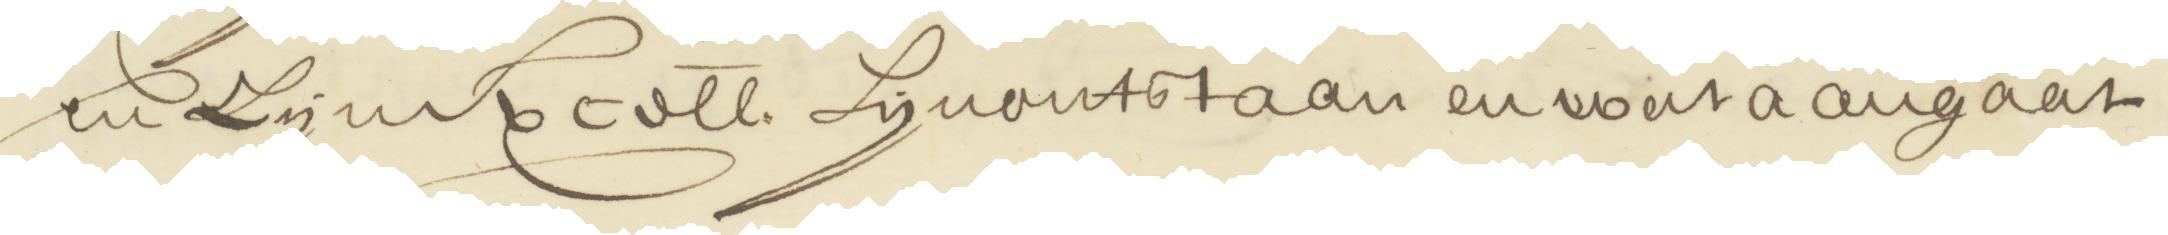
en zijn Excell. sijn ontstaan en wat aangaat
